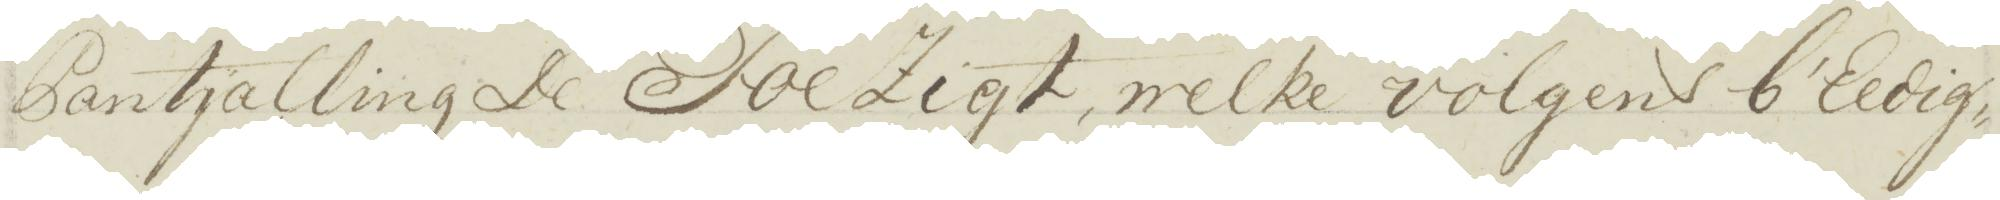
Pantjalling De Toezigt, welke volgens b'Eedig„
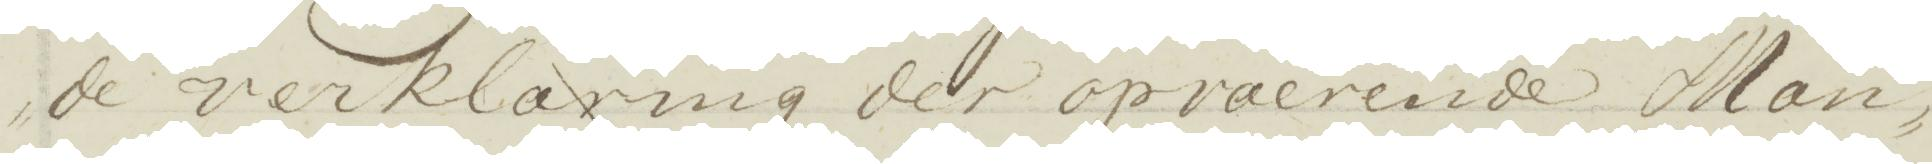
„de verklaring der opvaerende Man
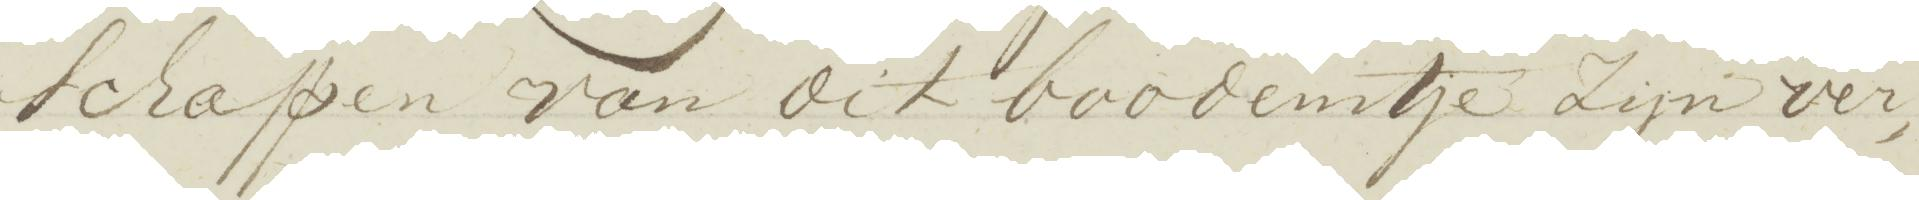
schappen van dit boodemtje zijn ver„
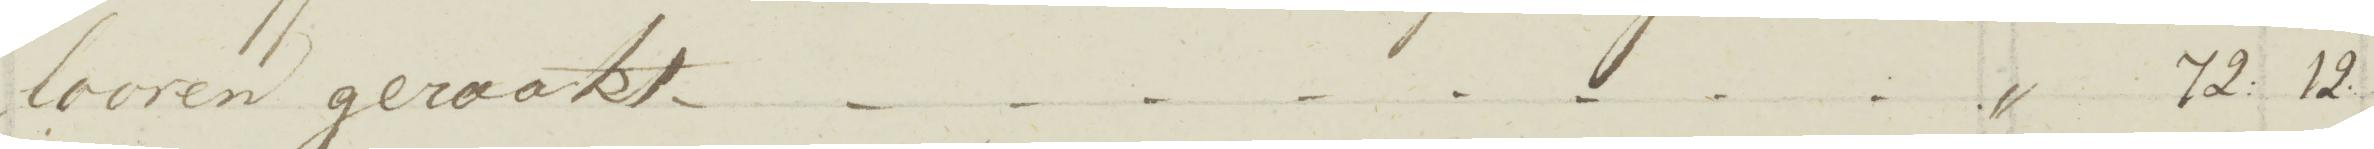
looren geraakt- - - - - - - - - .„ 72: 12:
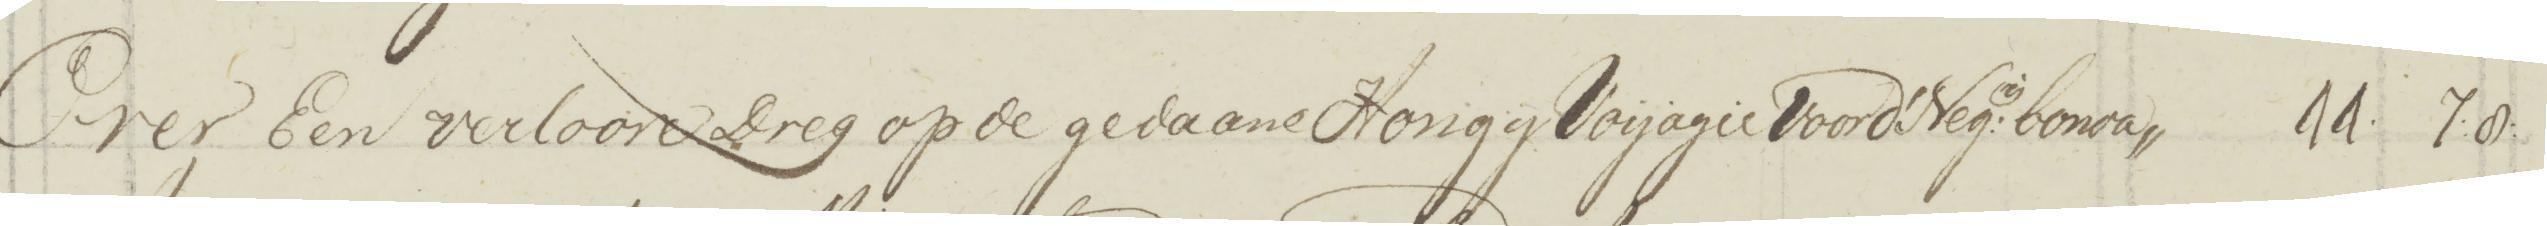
Over Een verloore Dreg op de gedaane Hongij Voijagie voord' Neg:ij bonoa„ 44.7:8:
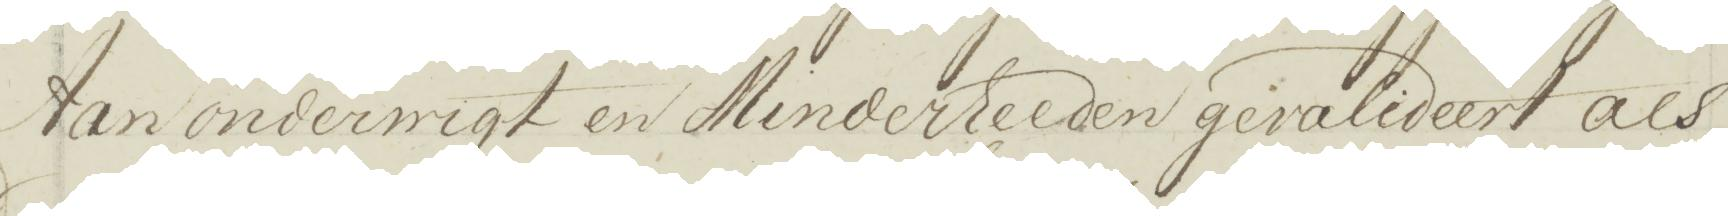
Aan onderwigt en Minderheeden gevalideert als
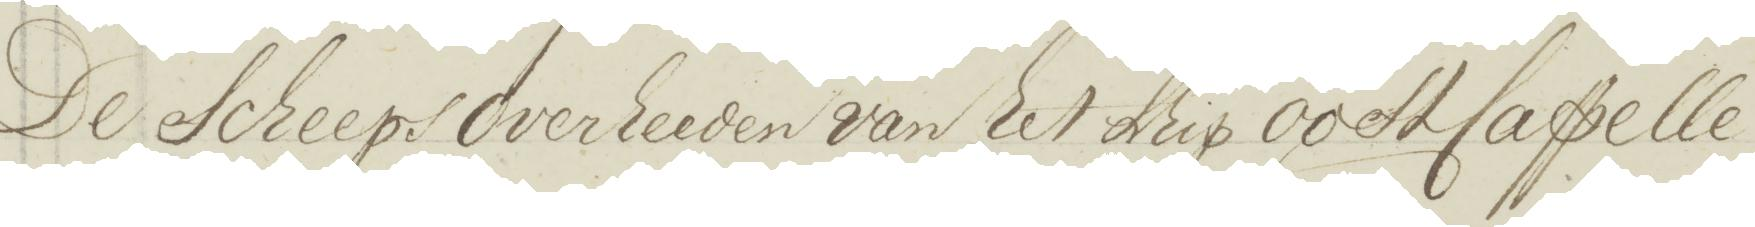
De scheeps overheeden van het schip oost Cappelle
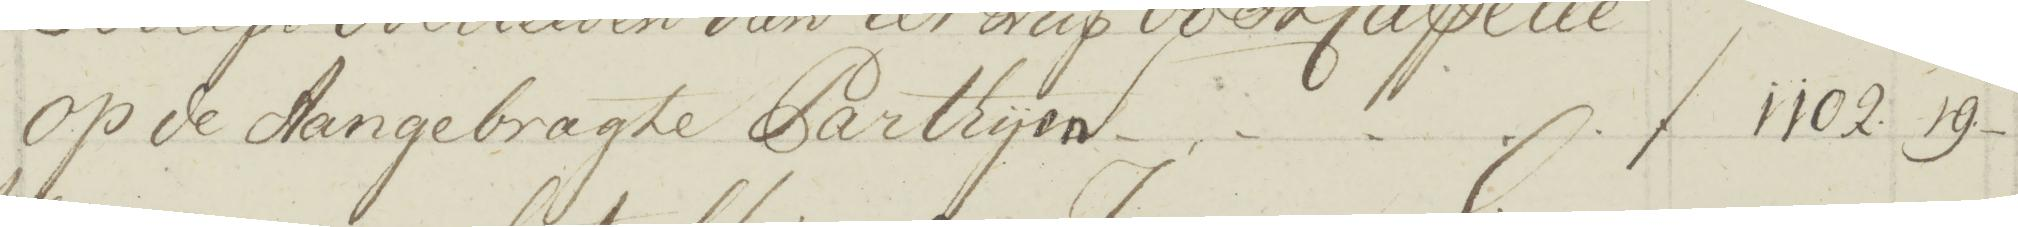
op de Aangebragte Parthijen - , - - . . ƒ 1102.19.-
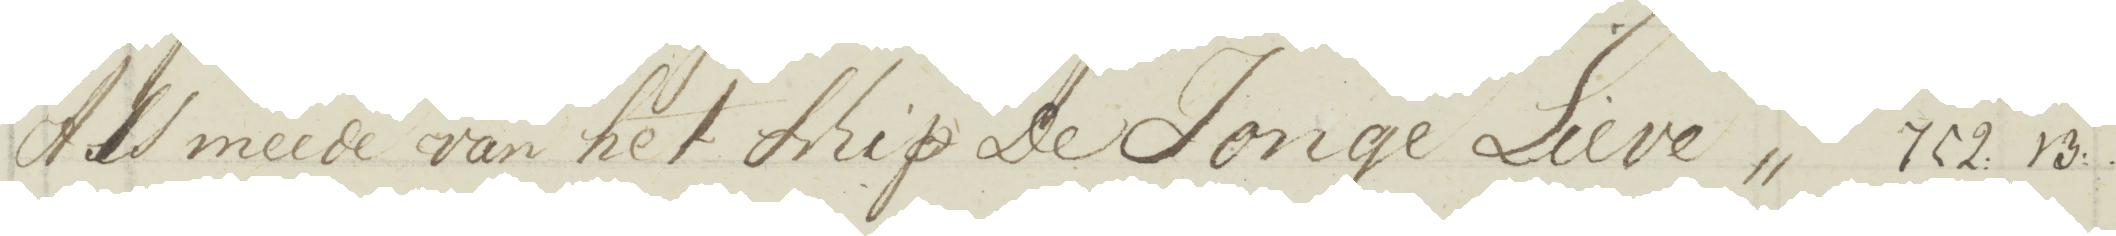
Als meede van het schip De Ionge Lieve „ 752:13:
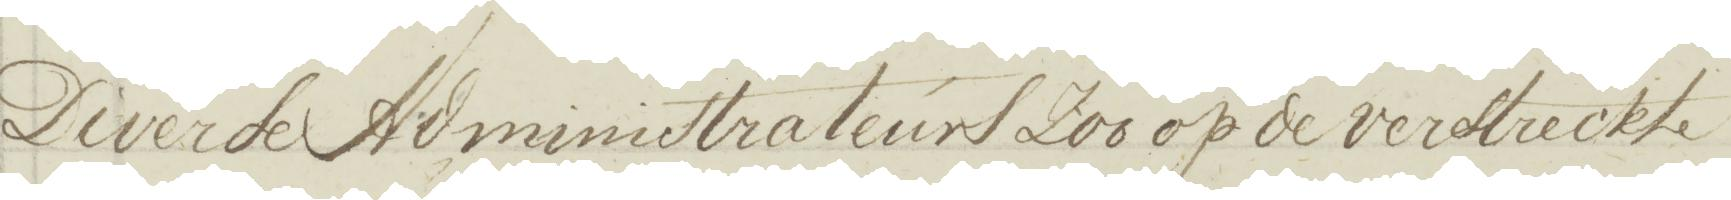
Diverse Administrateurs zoo op de verstreckte
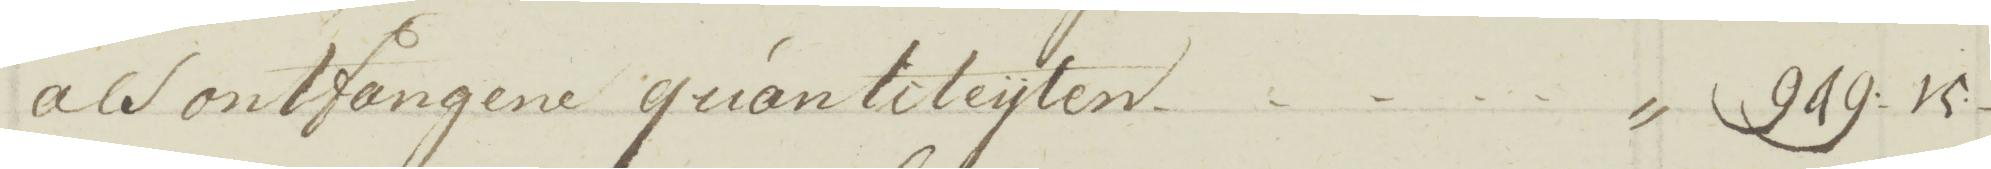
als ontfangene quantiteijten - - - - - „ 949:15.
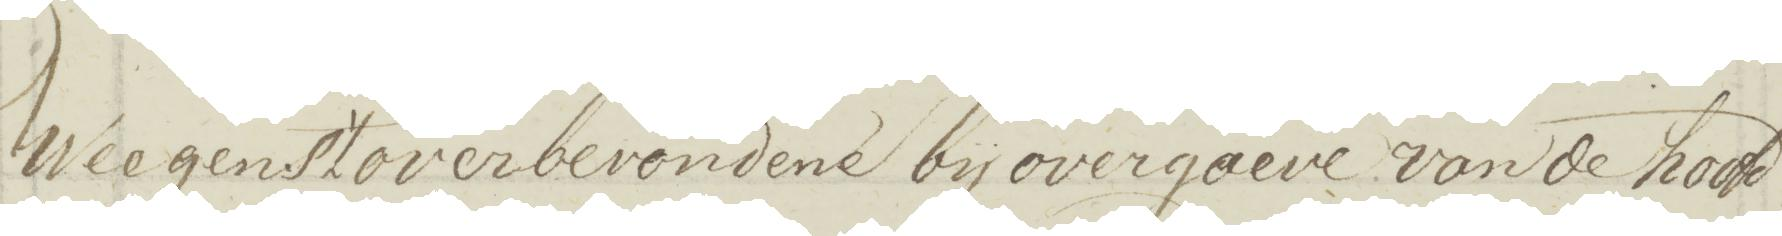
Weegens'toverbevondene bij overgaeve van de hoofd
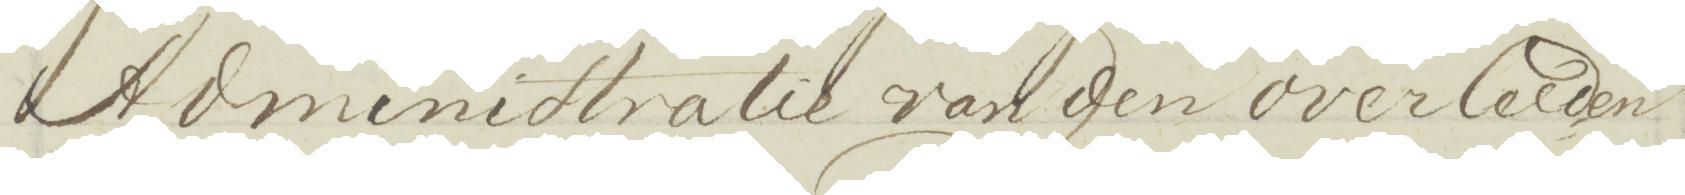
Administratie van den overleeden
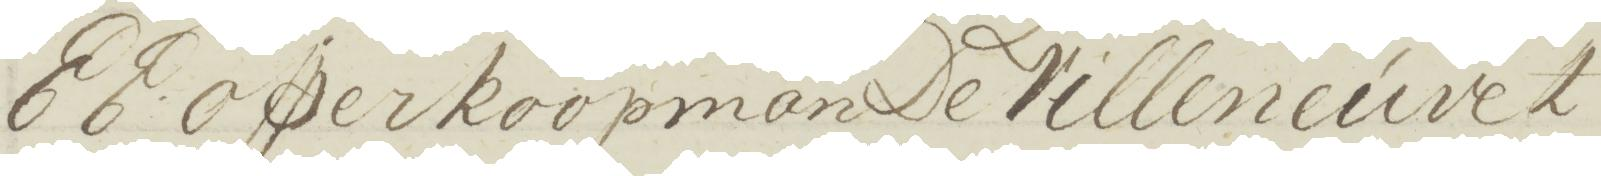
E E: opperkoopman De Villeneuve 't
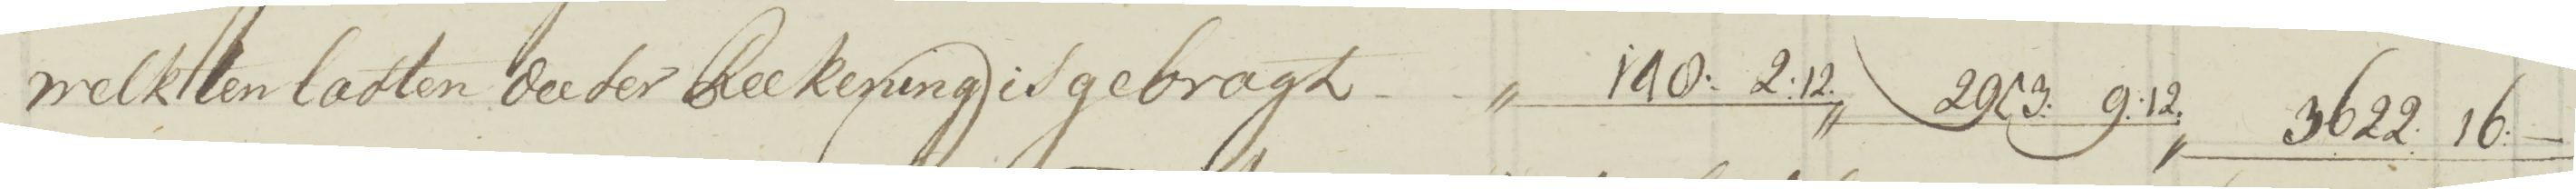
welk ten lasten deeser Reekening is gebragt - - „ 148:2:12.„ 2953:9:12:„ 3622:16:—
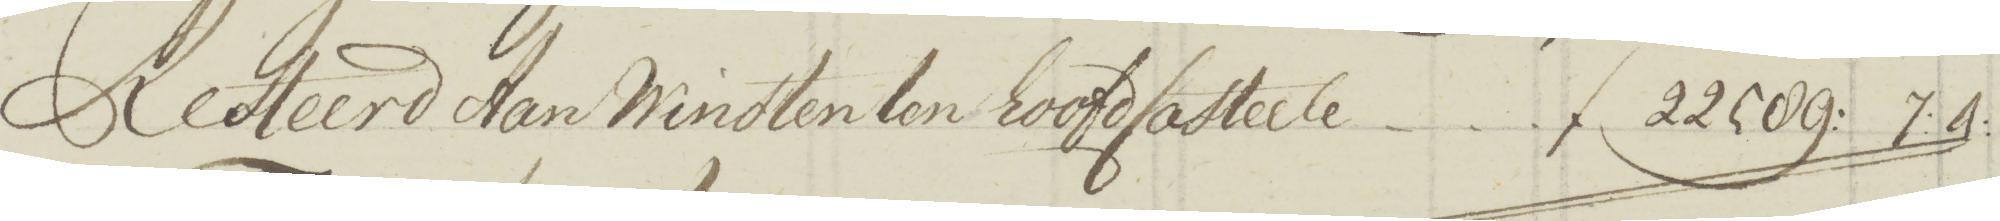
Resteerd Aan Winsten ten hoofdCasteele ƒ 22589:7:4:
